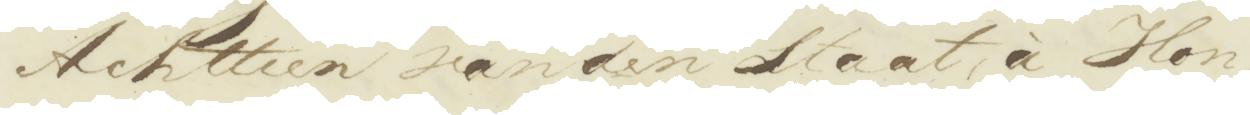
Achttien van den Staat, à Hon
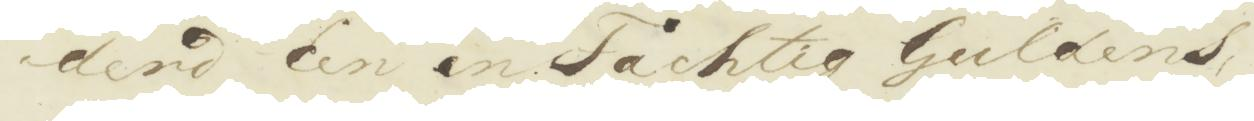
derd Een en Tachtig Guldens,
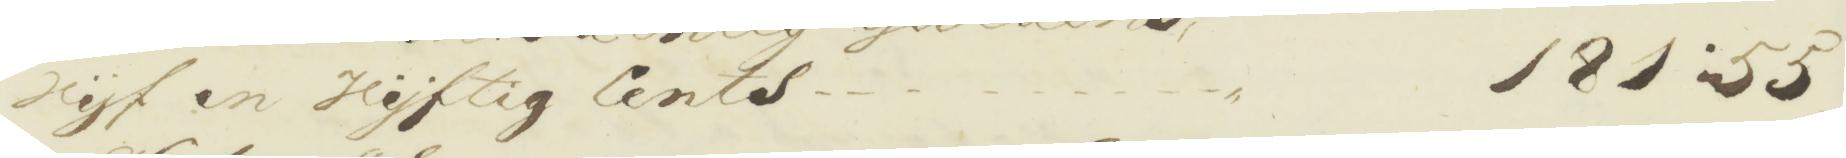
vijf en vijftig Cents - - - - - - - - - „ 181:55
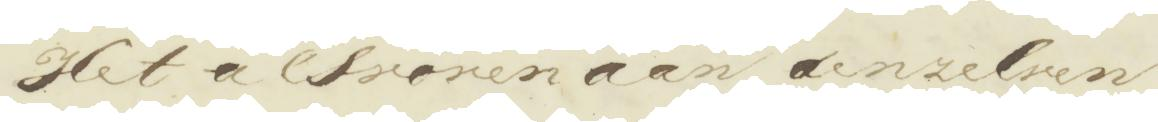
Het alsvoren aan denzelven
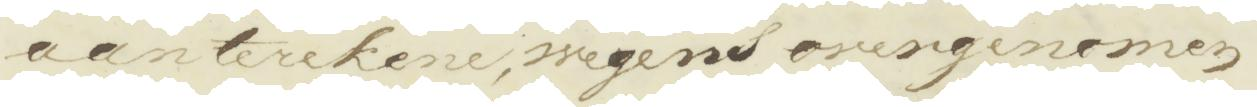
aan terekene, wegens overgenomen
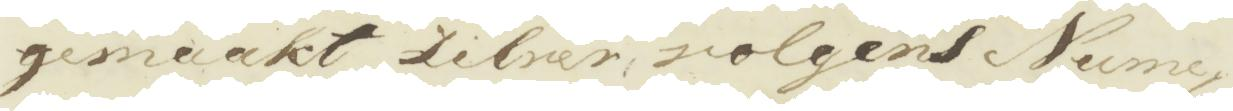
gemaakt zilver, volgens Nume,
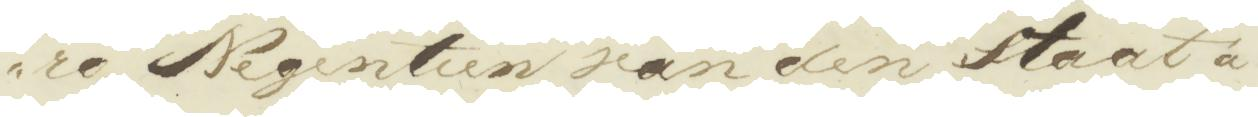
„ro Negentien van den Staat à
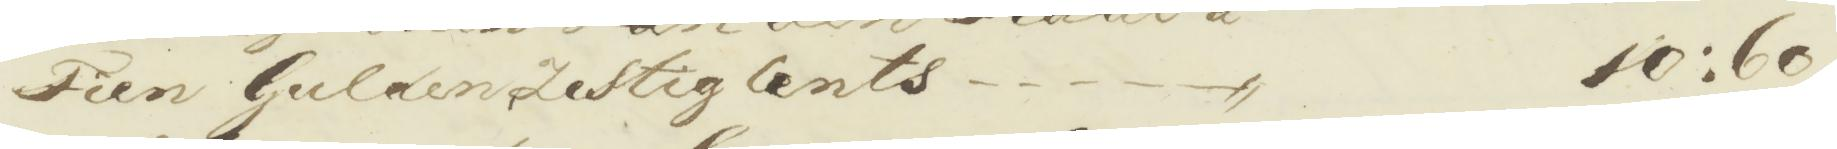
Tien Gulden zestig Cents - - - - -„ 10:60
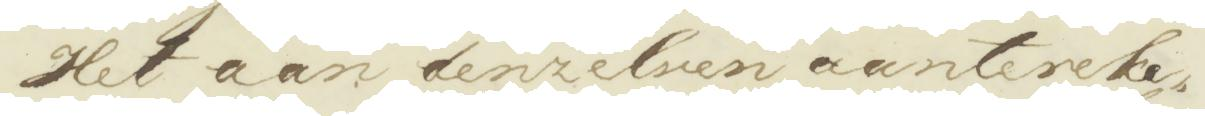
Het aan denzelven aantereke„
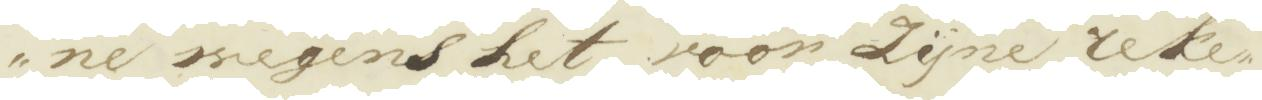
„ne wegens het voor Zijne reke„
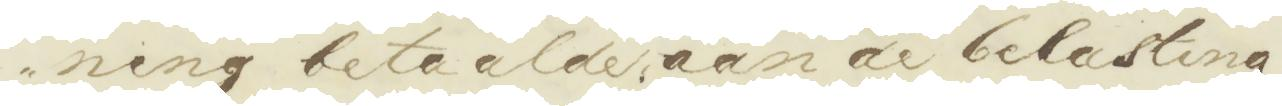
„ning betaalde, aan de belasting
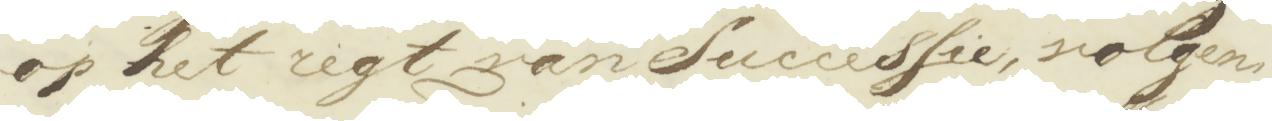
op het regt van Successie, volgen
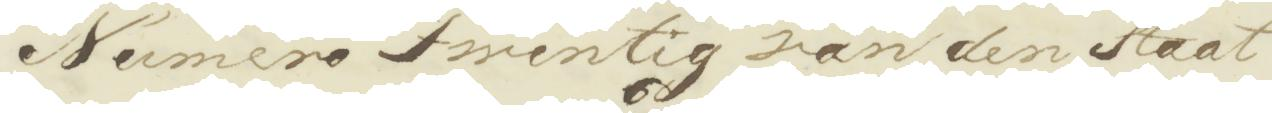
Numero Twintig van den Staat
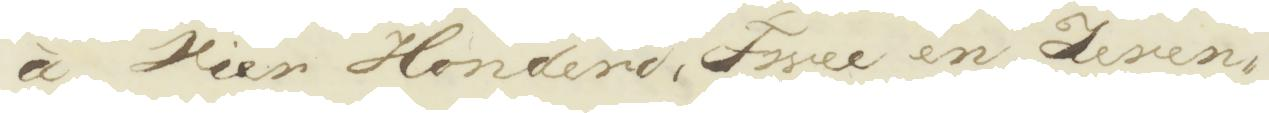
à Vier Honderd, Twee en Zeven„
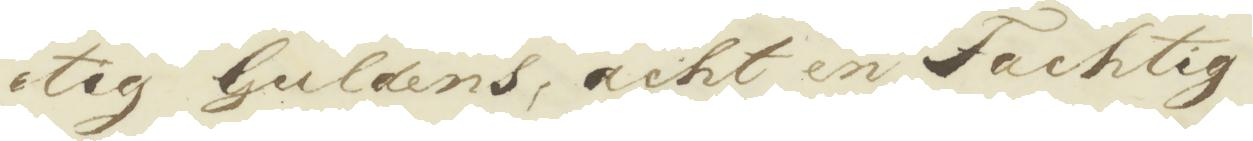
tig Guldens, acht en Tachtig
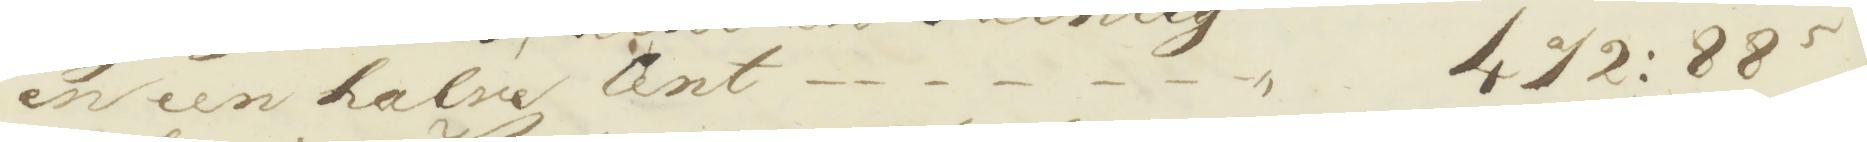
en een halve Cent - - - - - - -„ 472: 88 5
